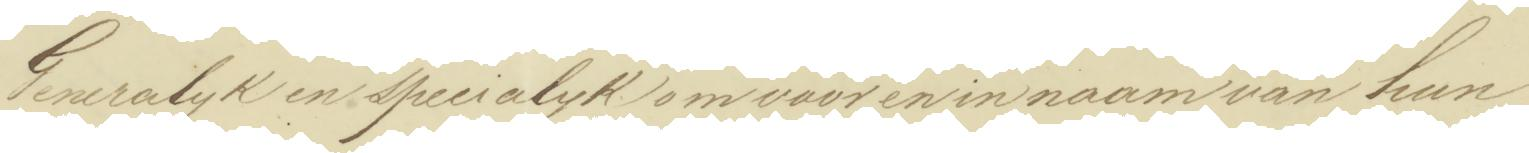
Generalyk en specialyk om voor en in naam van hun
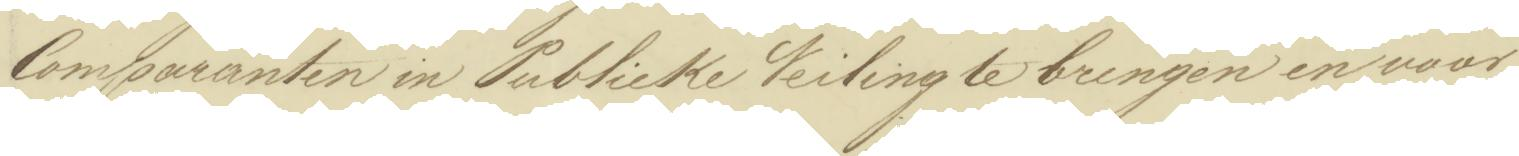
Comparanten in publieke Veiling te brengen en voor
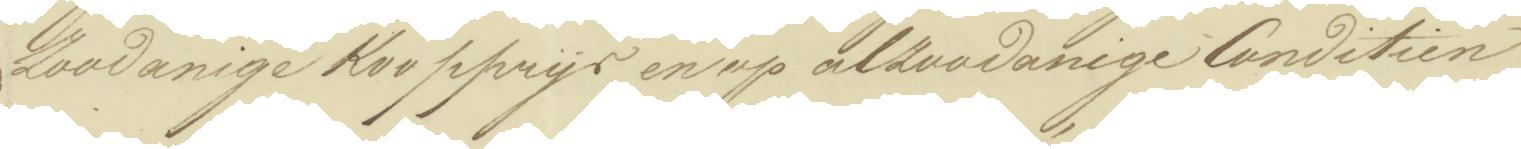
Zoodanige koopprijs en op alzoodanige Conditien
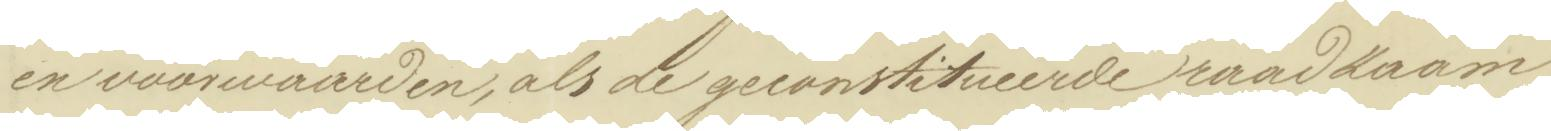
en voorwaarden, als de geconstitueerde raadzaam
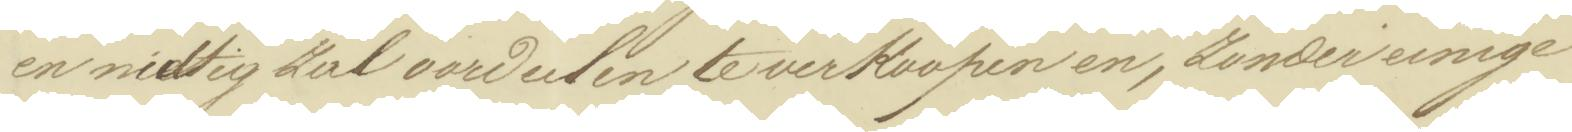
en nuttig Zal oordelen te verkoopen en, zonder einige
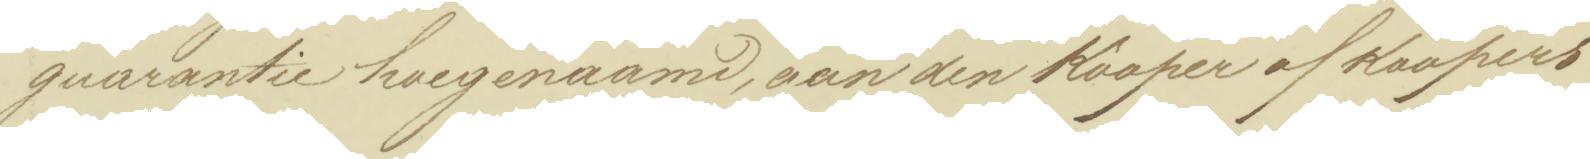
guarantie hoegenaamd, aan den Kooper of Koopers
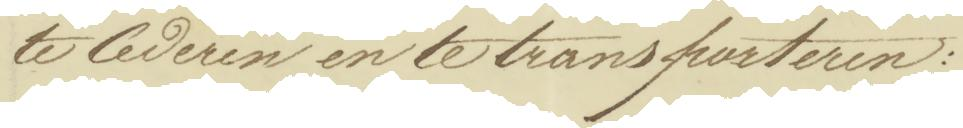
te leveren en te transporteren:
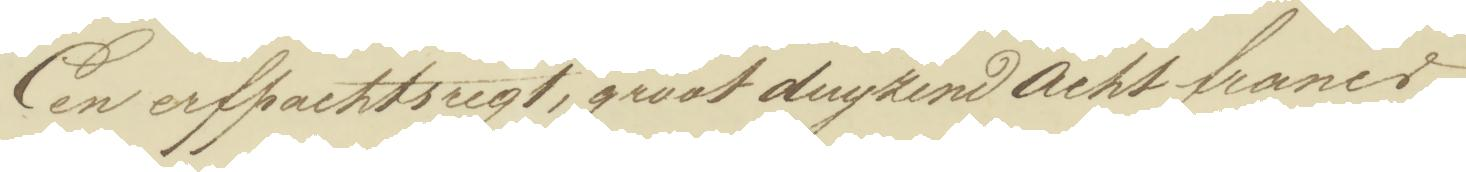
Een erfpachtsregt, groot duyzend acht francs
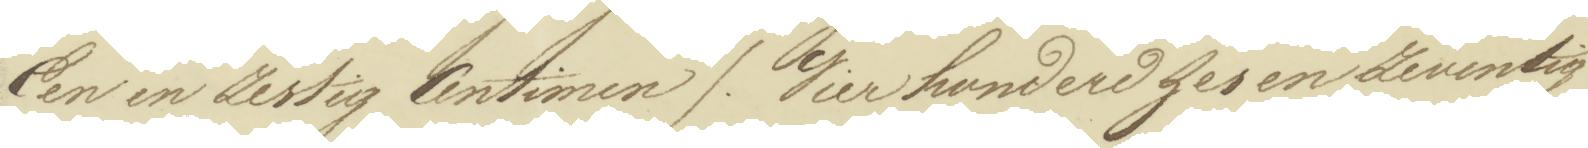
Een en zestig Centimen /. Vier honderd zes en zeventig
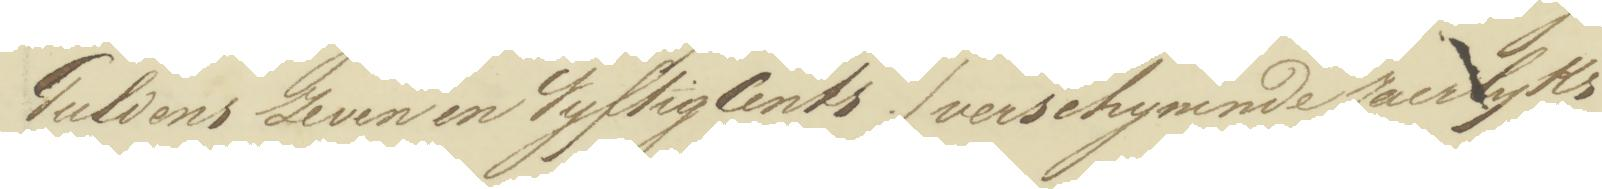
Guldens zeven en Vyftig Cents ./ verschynende jaerlyks
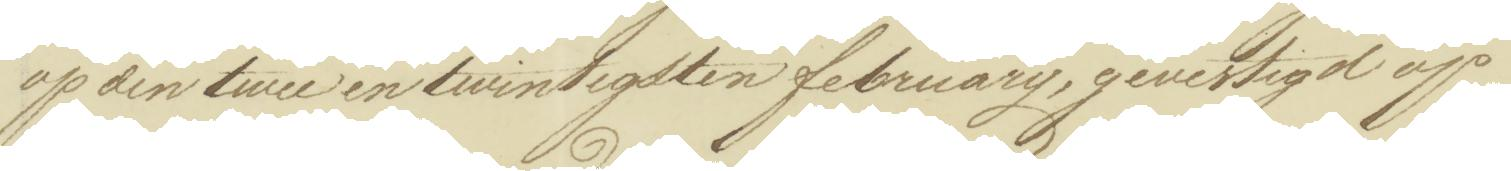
op den twee en twintigsten february, gevestigd op
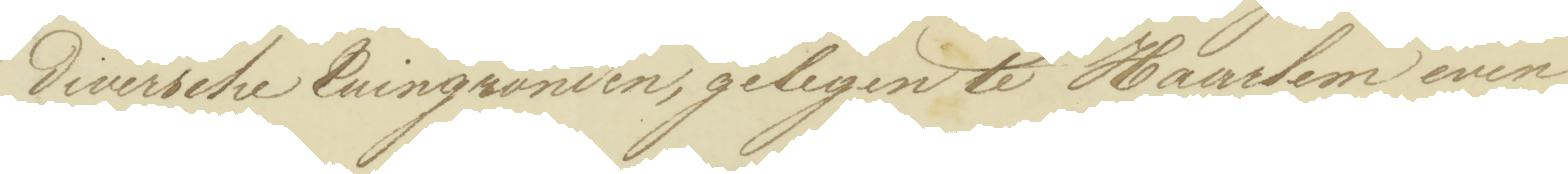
Diversche Tuingronden, gelegen te Haarlem even
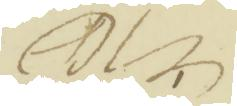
Blz
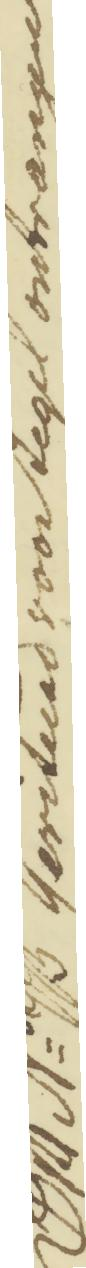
D14 N=o Geviteerd voor Zegel ontvangen
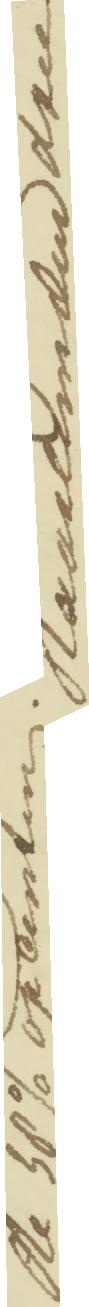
de 38% opcenten. Haarlem den drie
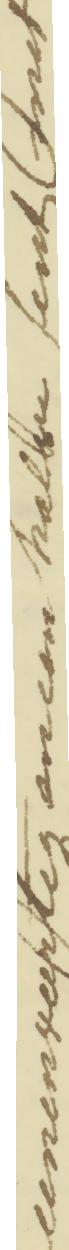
eenenveertig en een halven cents met
